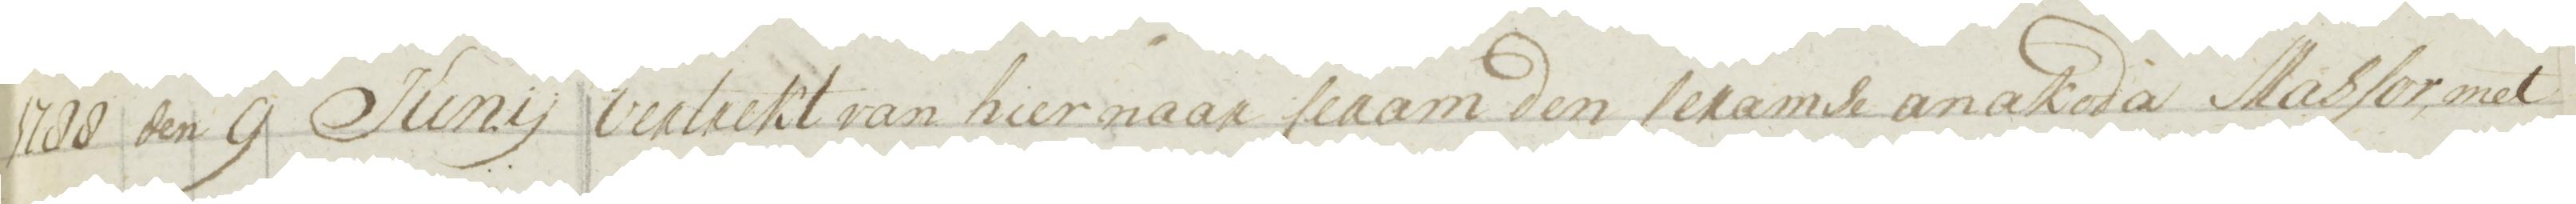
1788 den 9 Iunij Vertrekt van hier naar Ceram den Ceramse anakoda Massor, met
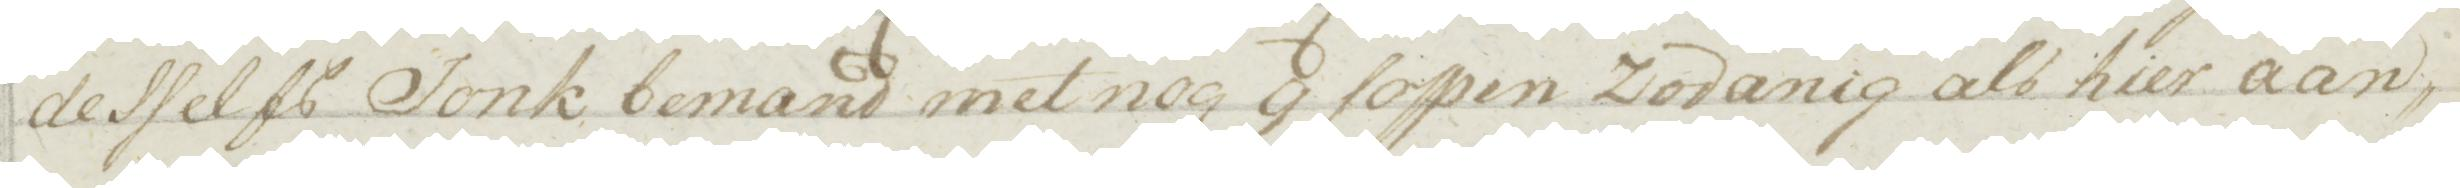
desselfs Ionk bemand met nog 9 Coppen zodanig als hier aan„
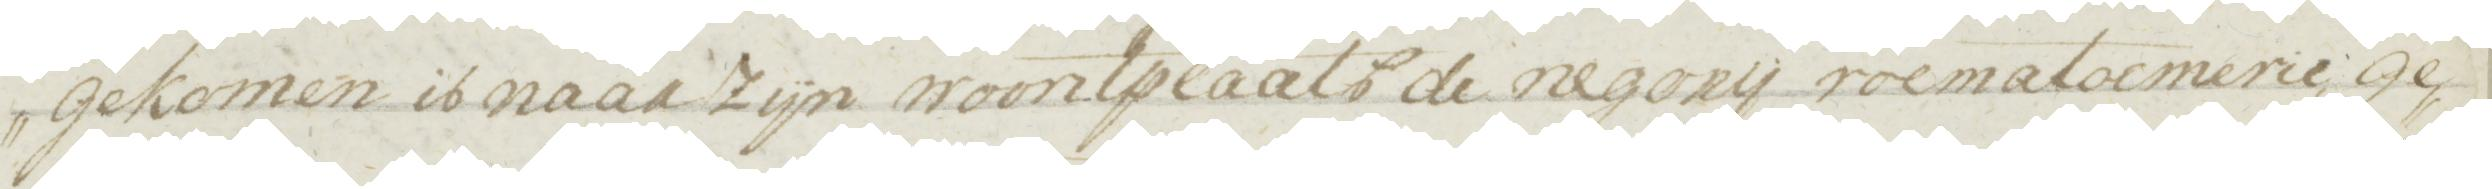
„ gekomen is naar zijn woontplaats de negorij roematoemerie, ge„
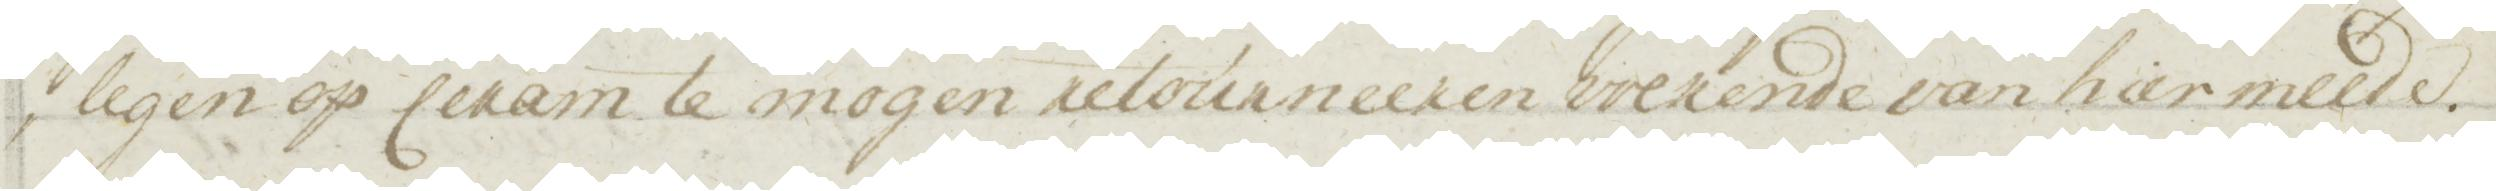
, legen op Ceram te mogen retourneeren voerende van hier meede.
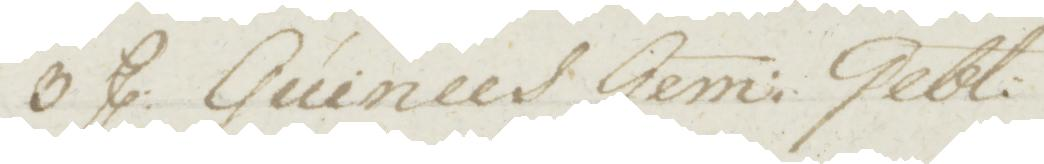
3 p:s Guinees Gem: Gebl:
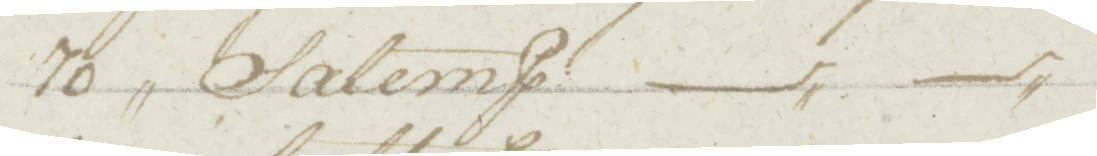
70 „ Salemp: _„ _„
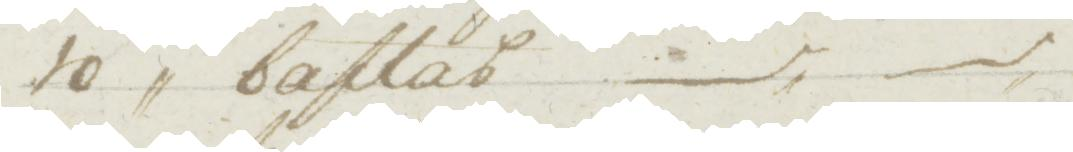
10 „ baftas _„ _„
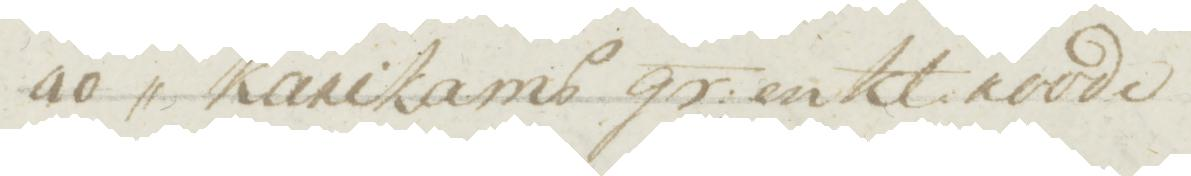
40 „ karikams gr: en kl: roode
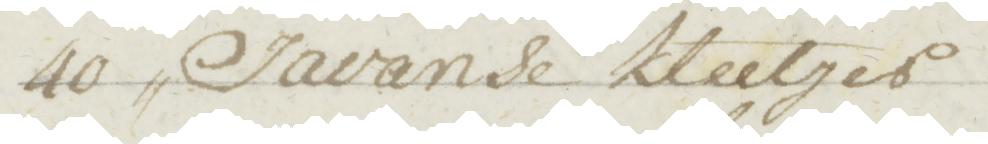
40 „ Iavanse kleetjes
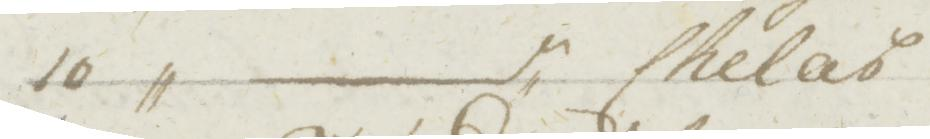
10 „ _„o Chelas
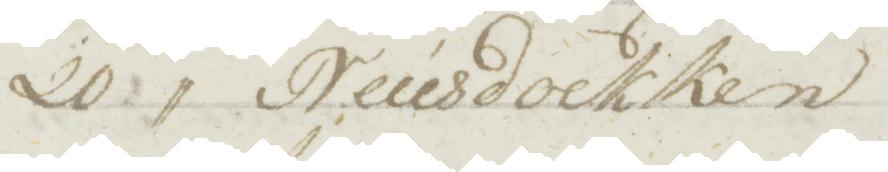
20 „ Neusdoekken
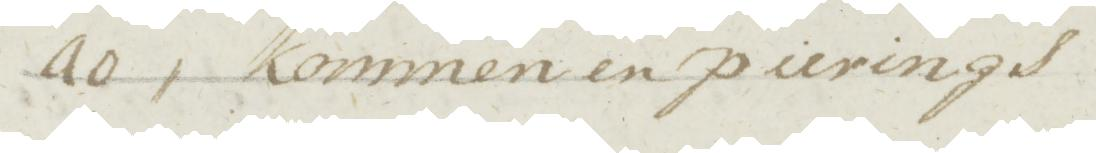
40 „ kommen en pierings
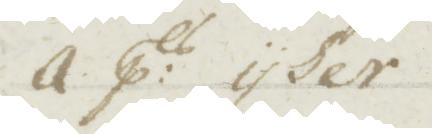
4 p:ls ijser
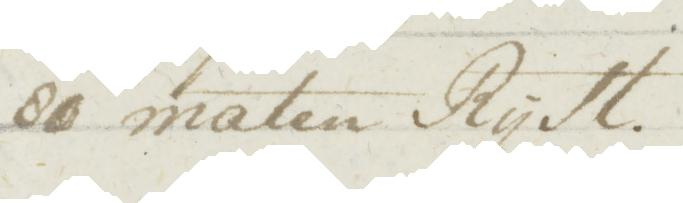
80 maten Rijst.
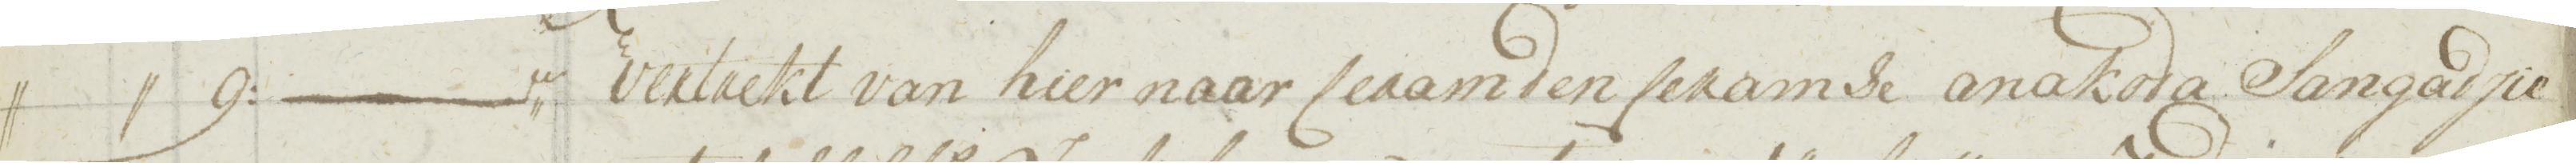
„ „ 9: _„o Vertrekt van hier naar Ceram den Ceramse anakoda Sangadjie
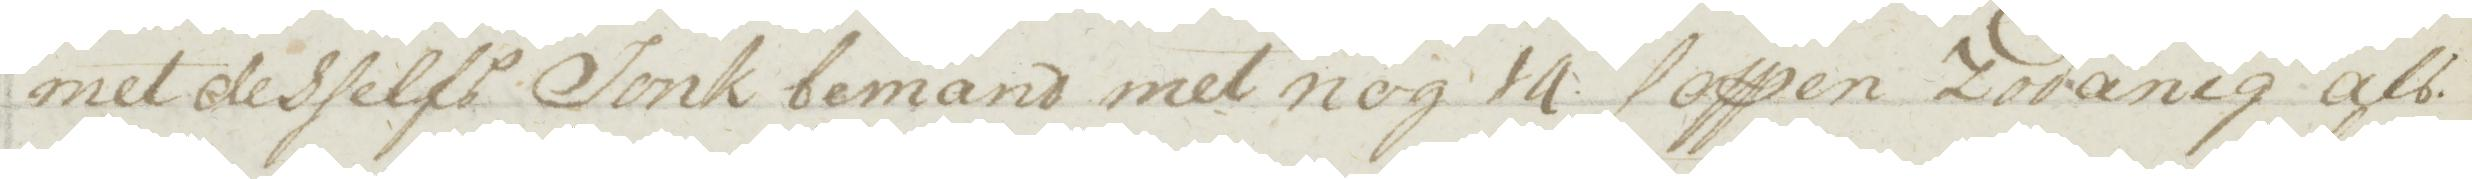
met desselfs Ionk bemand met nog 14: Coppen zodanig als
